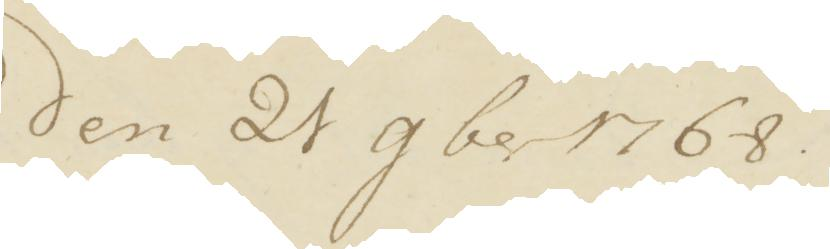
den 21 9ber 1768.
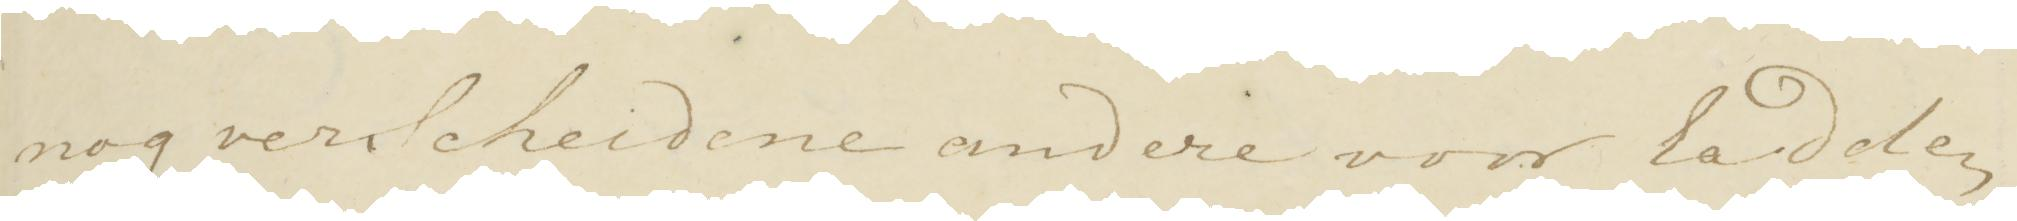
nog verscheidene andere voor hadden
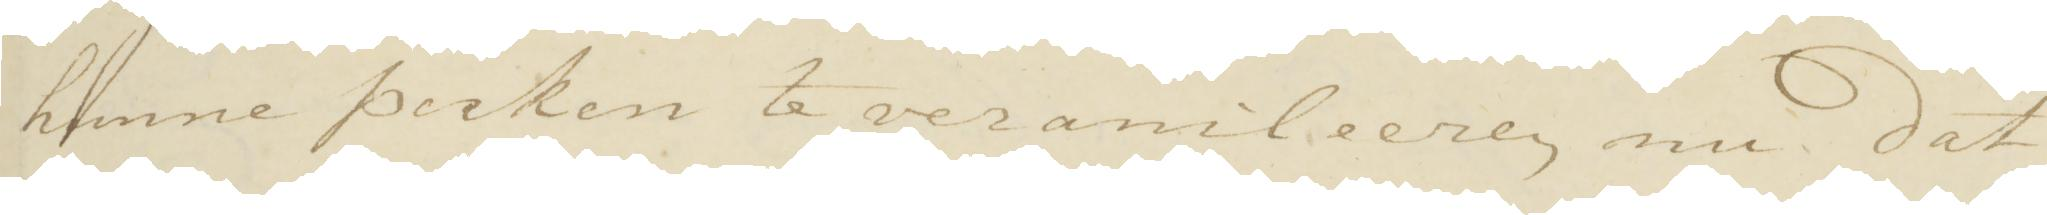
hunne perken te veranileeren nu dat
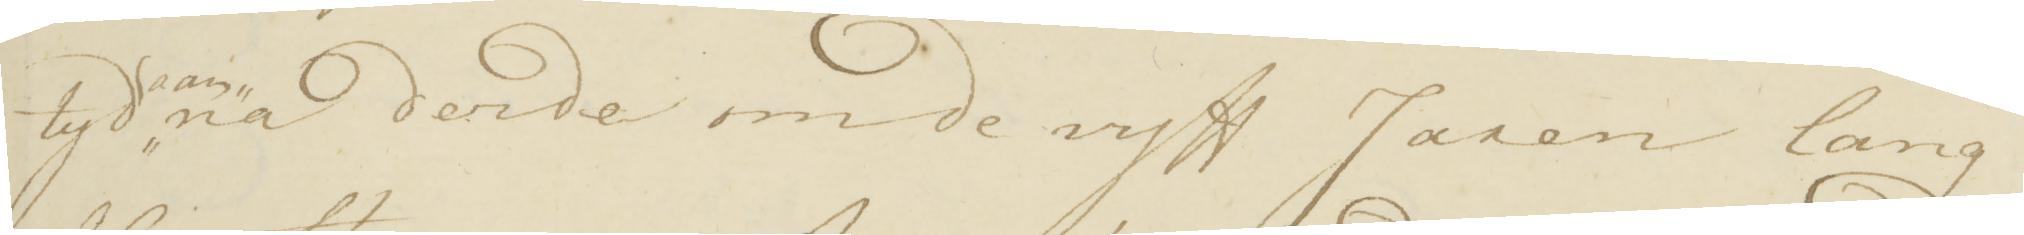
tyd„ aan„ na na derde om de vyff Jaren lang
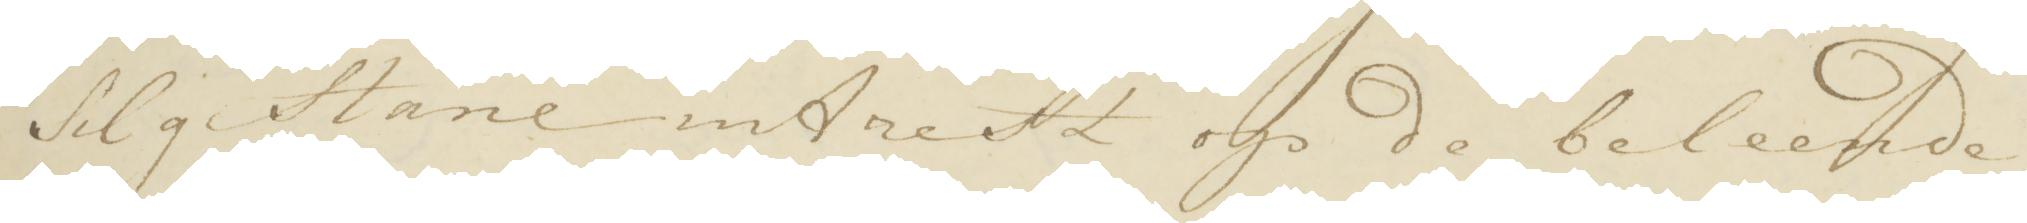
silgestane intrest op de beleende
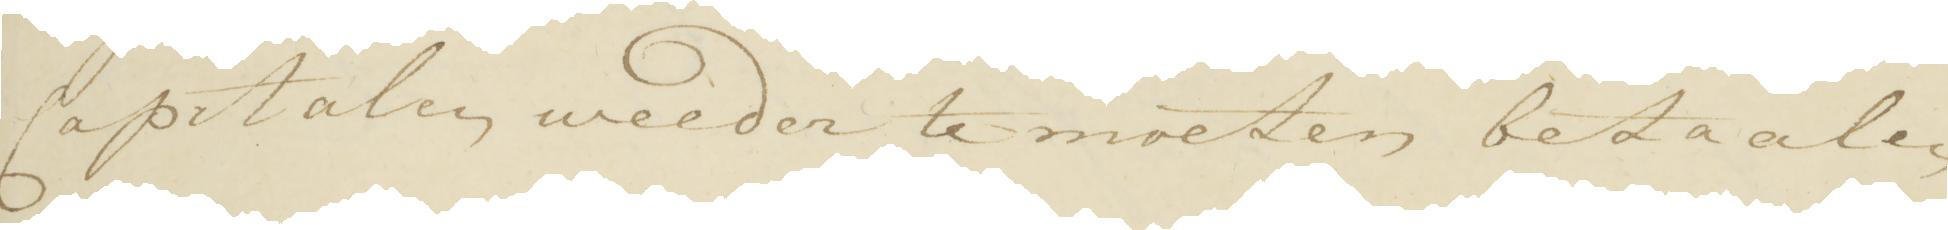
capitalen weeder te moeten betaalen
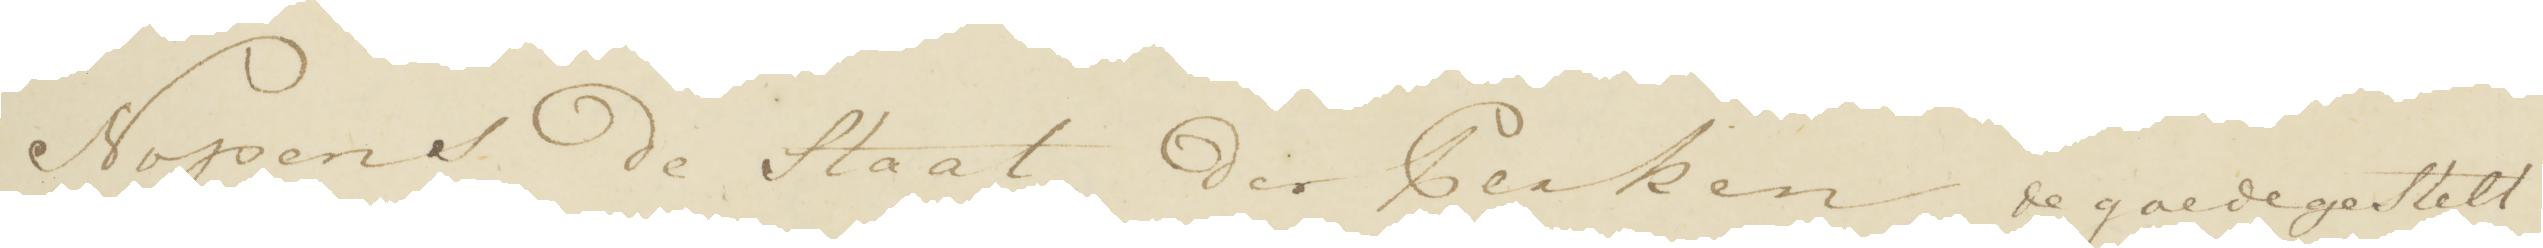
Nopens de Staat der Perken de goedegestelt
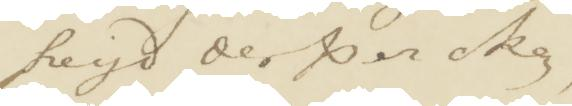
heijd der Percken,
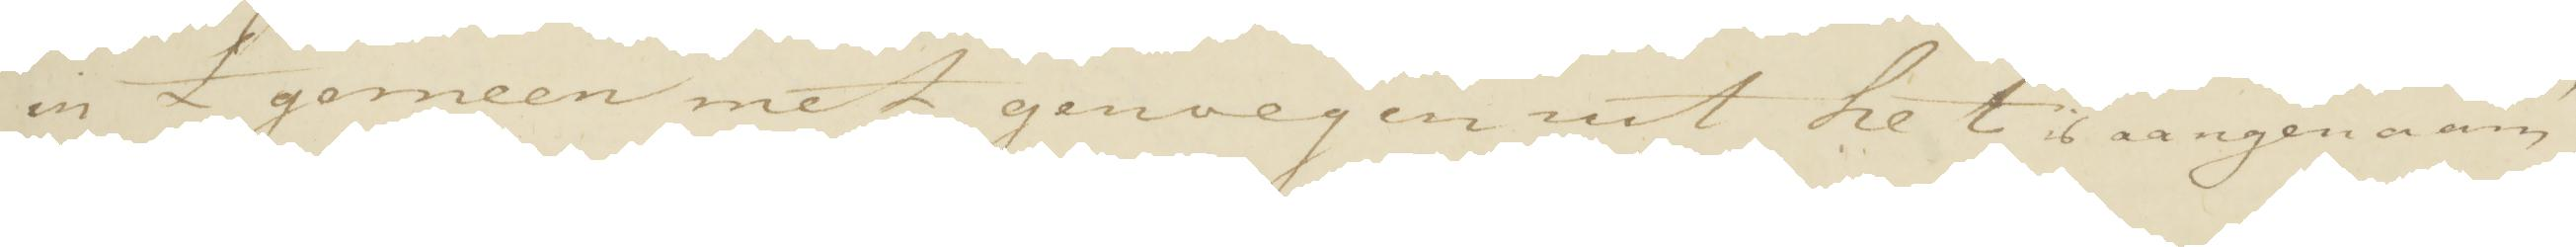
in t gemeen met genoegen uit het is aangenaam
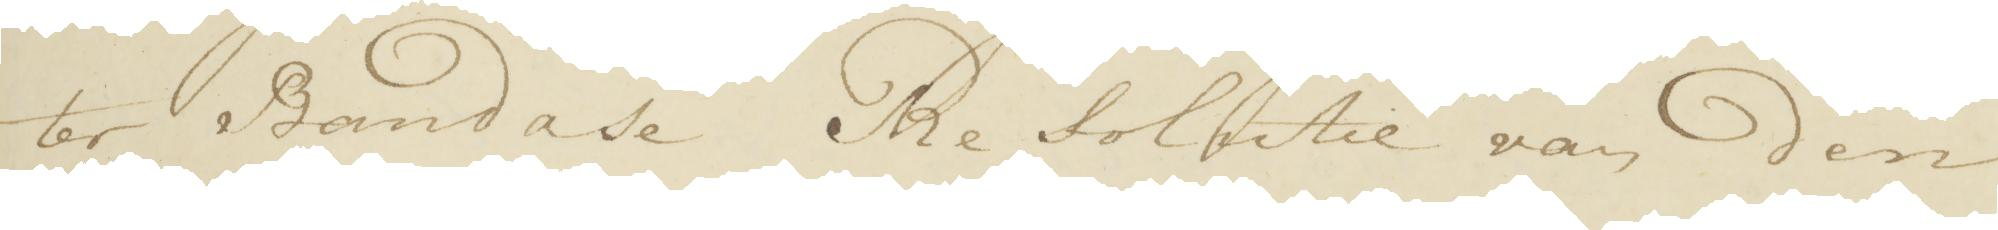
ter Bandase Resolutie van den
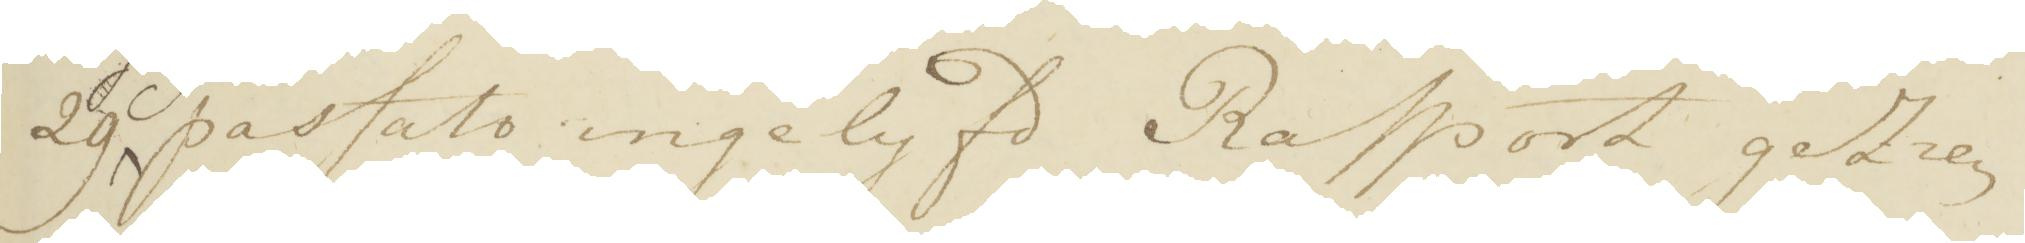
29 ^ passato ingelyfd Rapport gezien
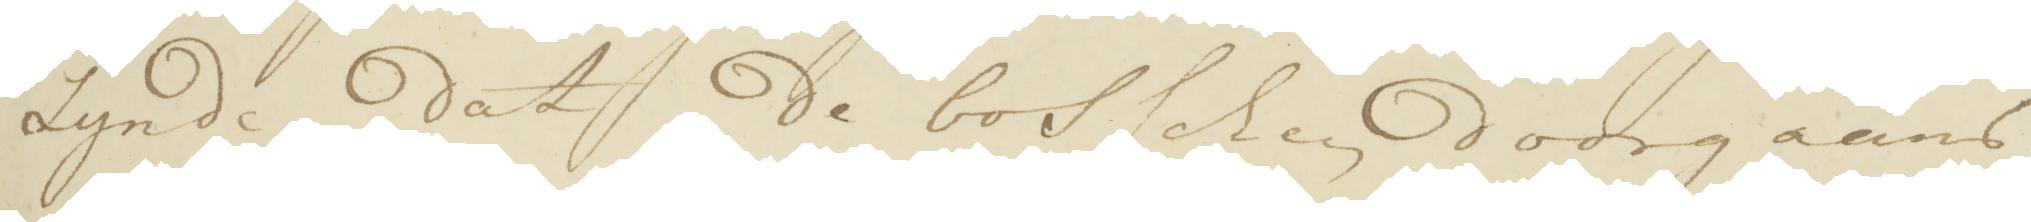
zynde dat de bosschen doorgaans
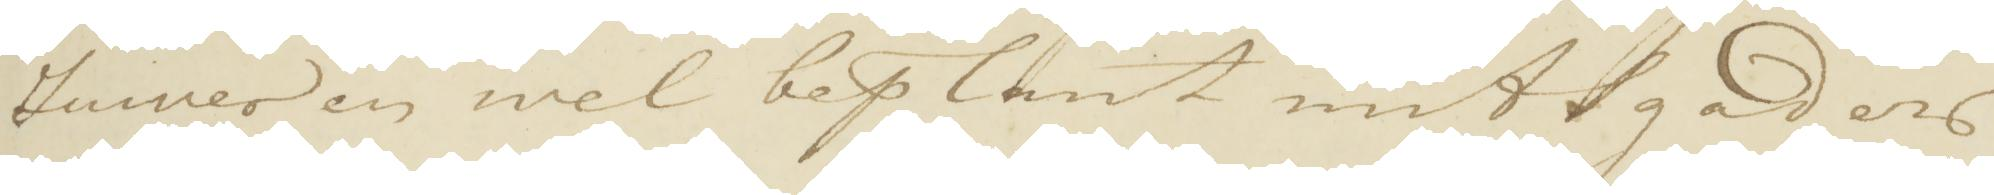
zuiver en wel beplant mitsgaders
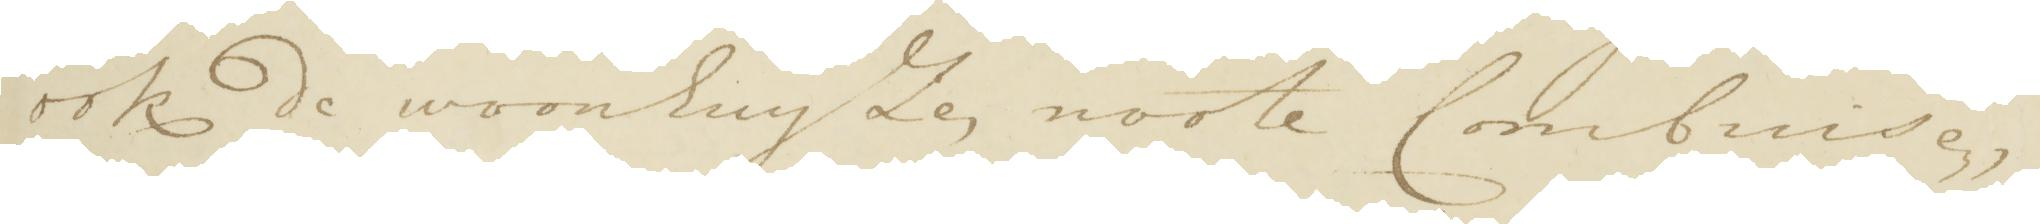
ook de woonhuyzen noote Combuisen,
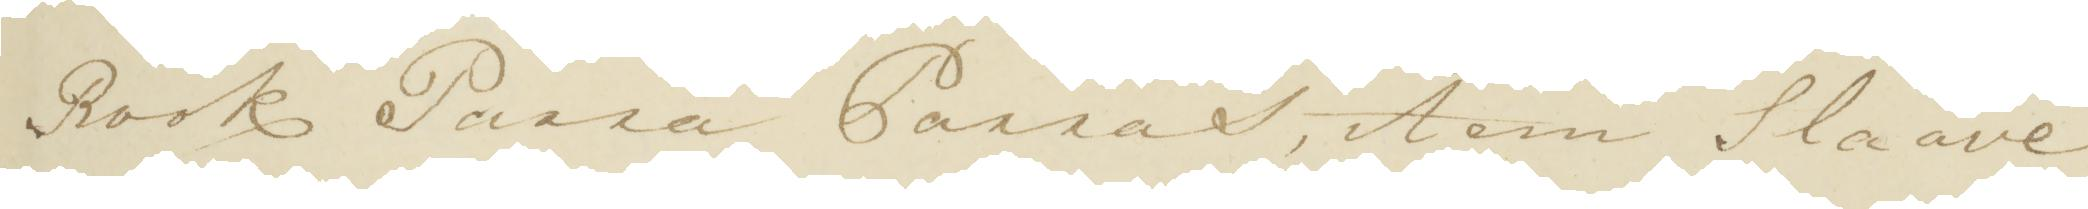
Rook Parra Parras, item slaave
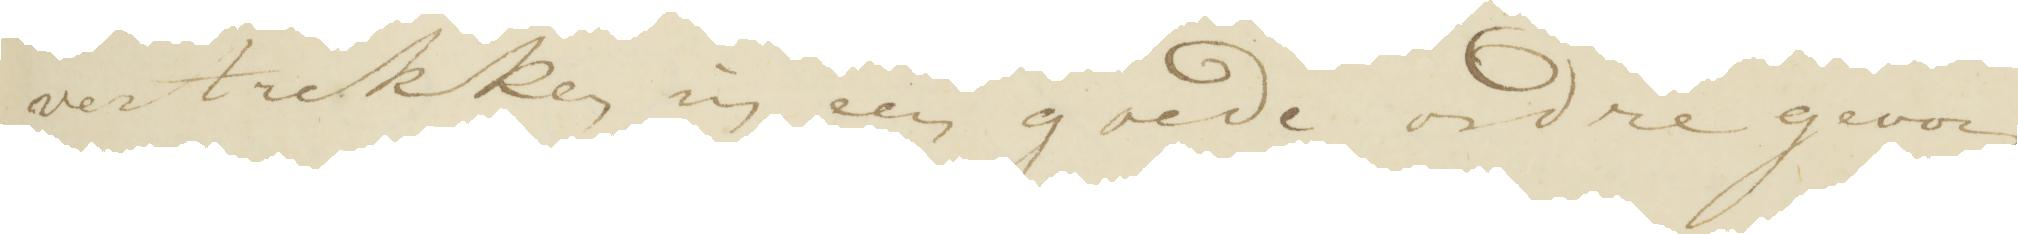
vertrekken in een goede ordre gevon
